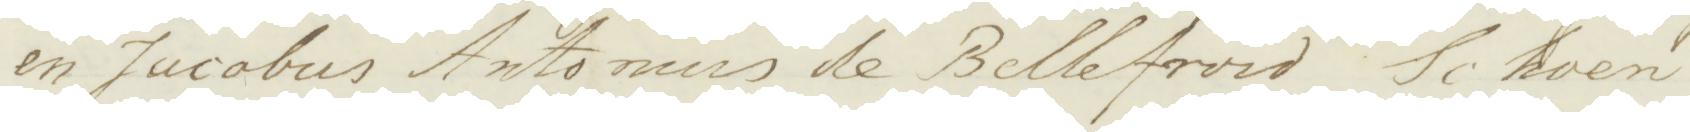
en Jacobus Antonius de Bellefroid Schoen
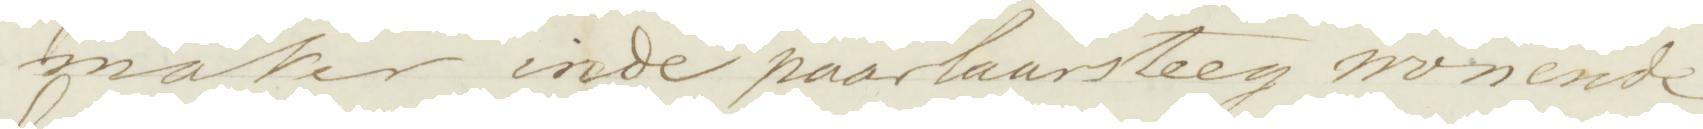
maker inde paarlaarsteeg wonende
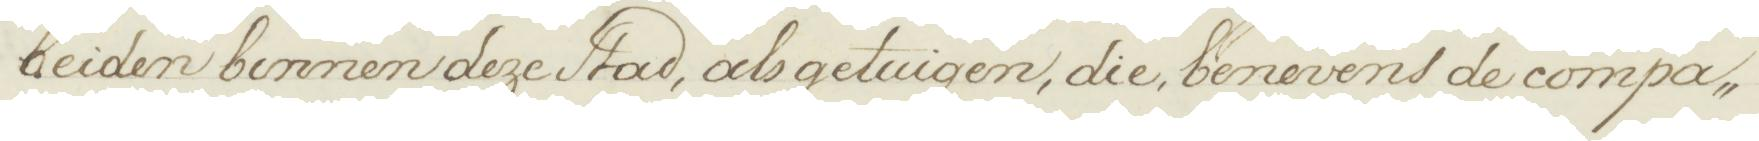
beiden binnen deze stad, als getuigen, die, benevens de compa„
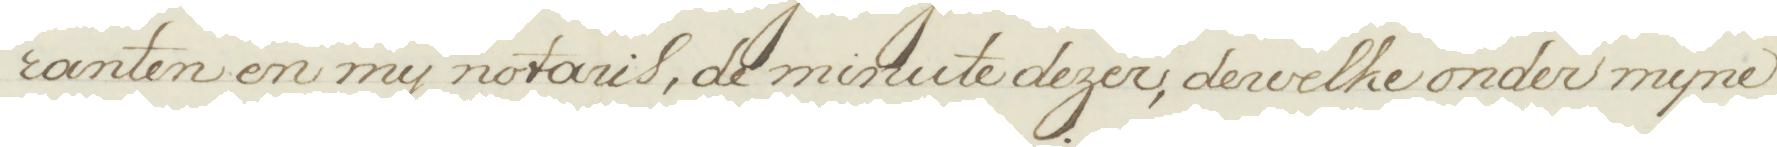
ranten en my notaris, de minute dezer, dewelke onder myne
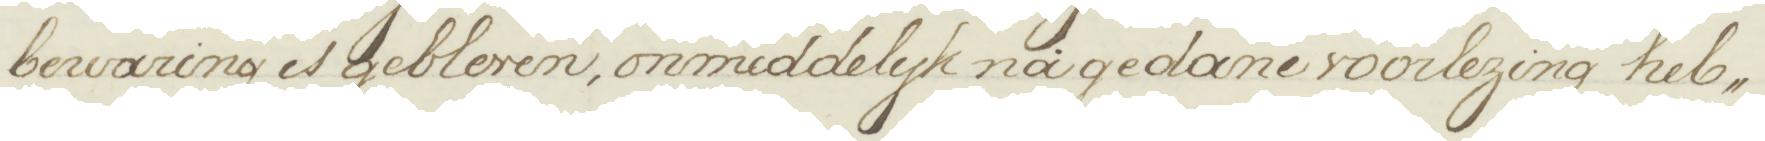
bewaring is gebleven, onmiddelyk na gedane voorlezing heb„
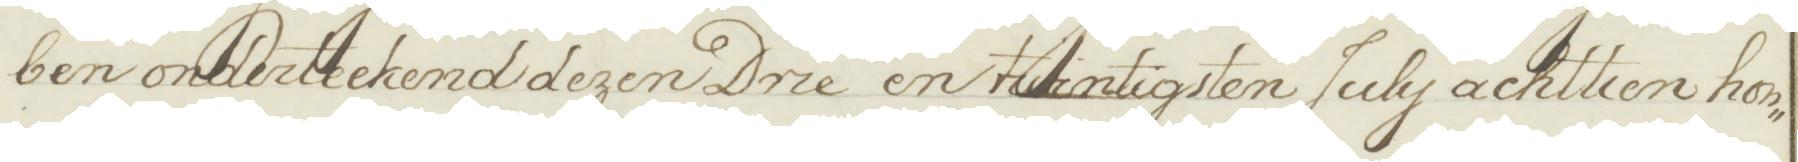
ben onderteekend dezen Drie en twintigsten July achttien hon„
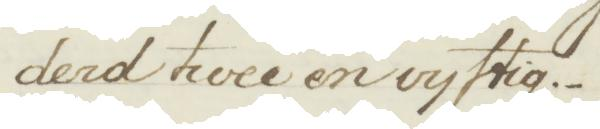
derd twee en vyftig.-
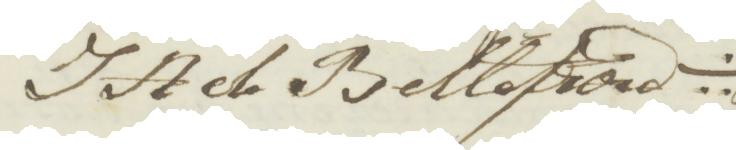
J A de Bellefroid:
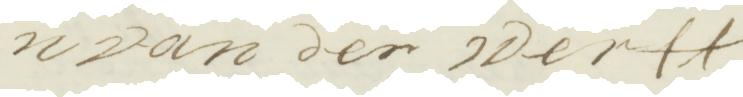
n van der Wertt
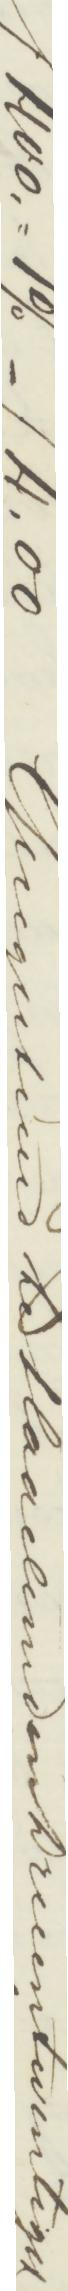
ƒ 400. „ 1% - ƒ 4.00 Geregistreerd te Haarlem den Drieentwintigsten
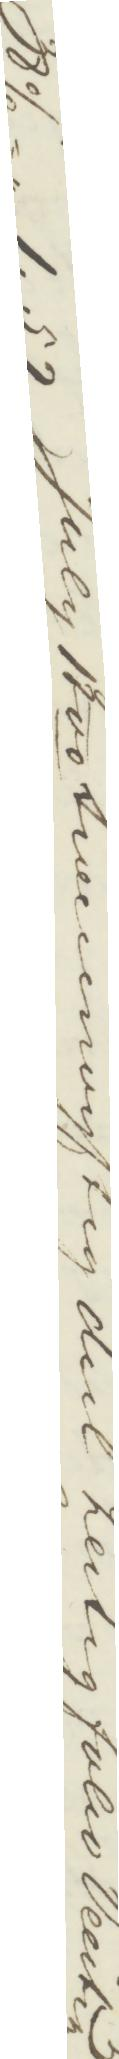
38% „ „ 1,52 July 1800 tweeenvyftig deel zestig folio veertig
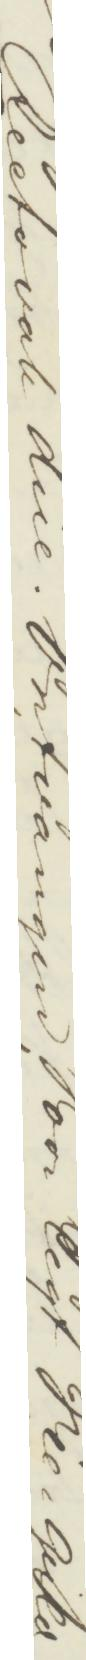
Recto vak drie. Ontvangen voor regt Vier gulden
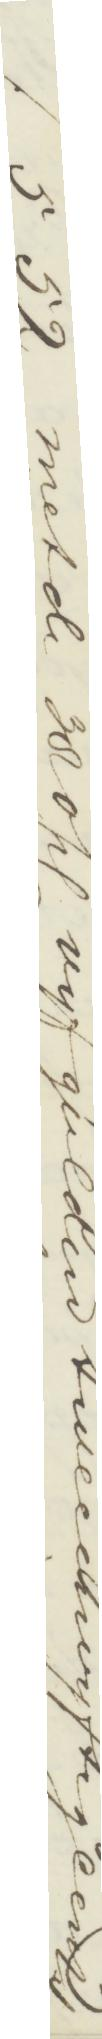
ƒ 5.52 met de 38 opC vyf gulden tweeenvyftig cents
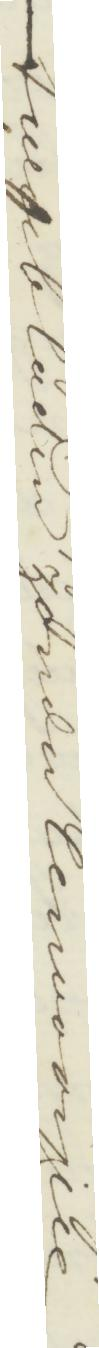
twee bladen zonder renvooij
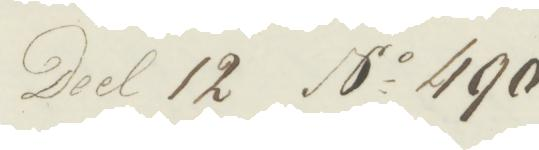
Deel 12 N=o 490
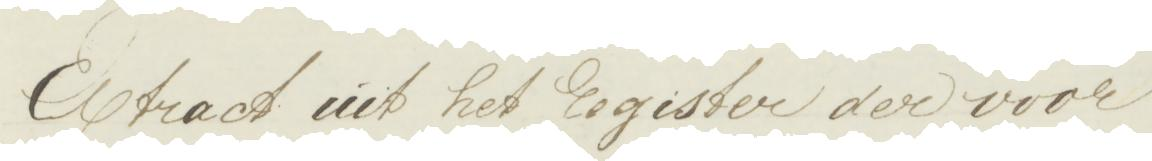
Extract uit het register der voor
